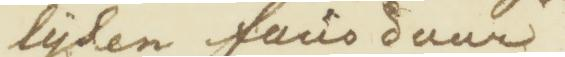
lijsen faus daar
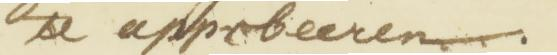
te appobeeren.
